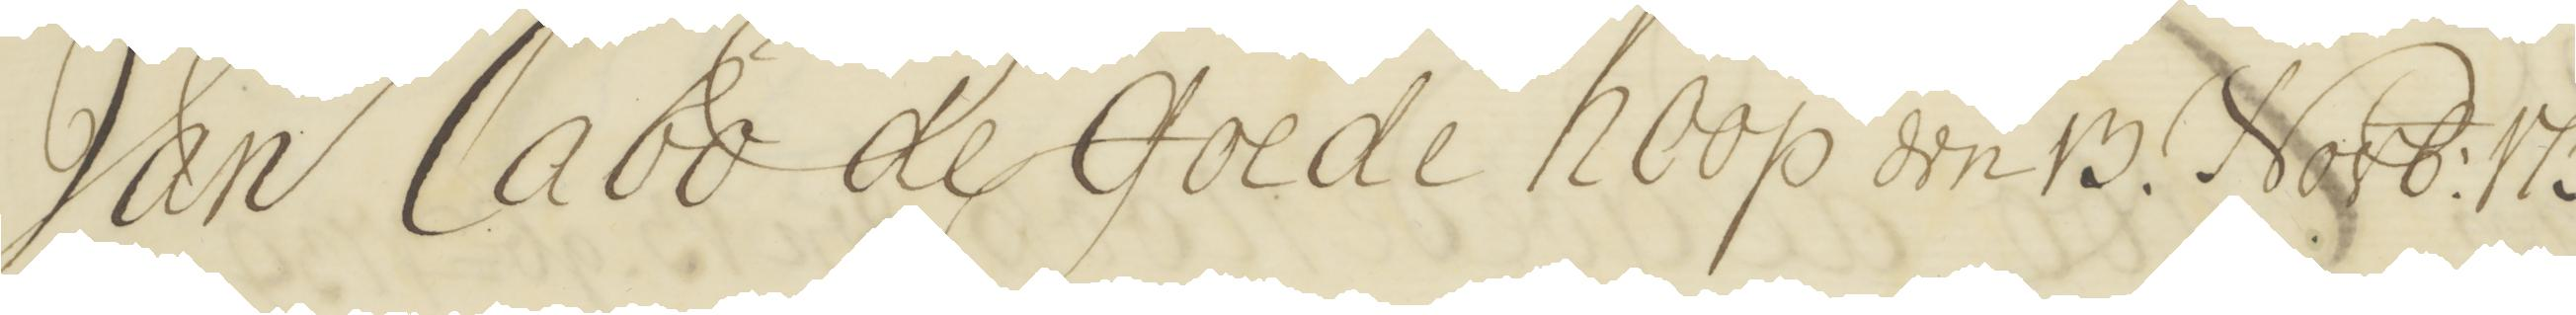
Van Cabo de Goede hoop den 13. Novb: 1739.
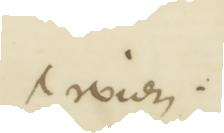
^ wien
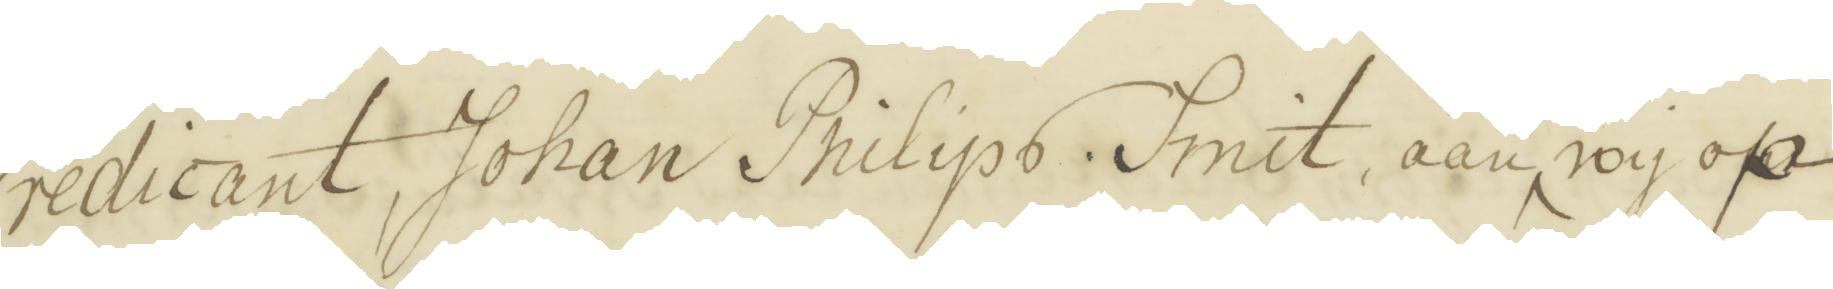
Predicant, Johan Philips Smit, aan wij op
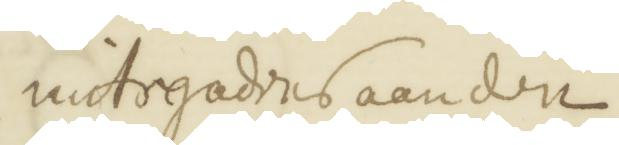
mitsgaders aan den
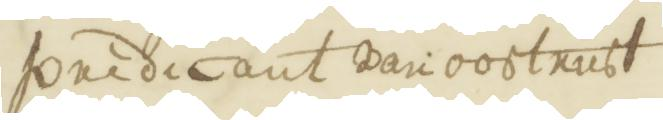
predicant van oostrust
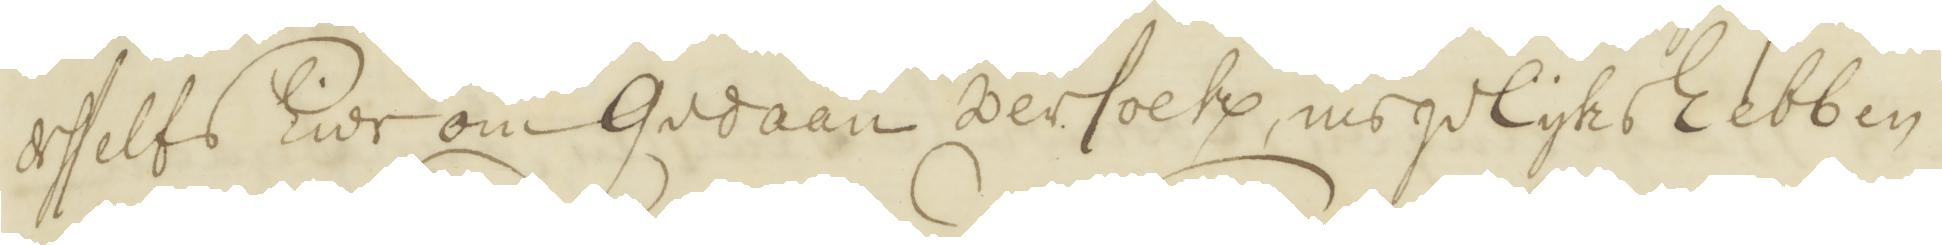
desselfs hier om gedaan versoek, insgelijks hebben
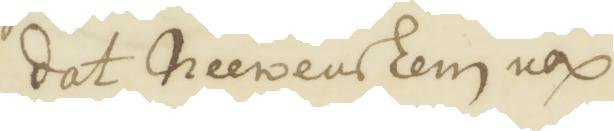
dat neevens hem na
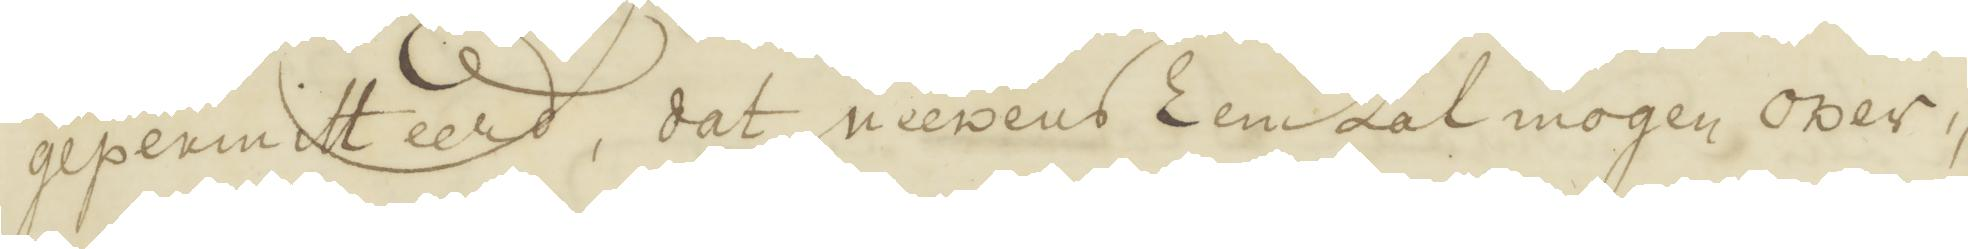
gepermitteerd, dat neevens hem zal mogen over„
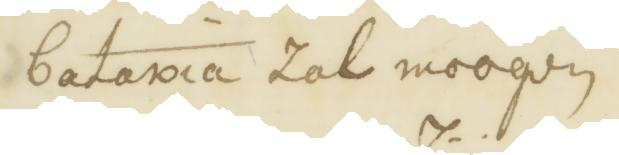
batavia zal moogen
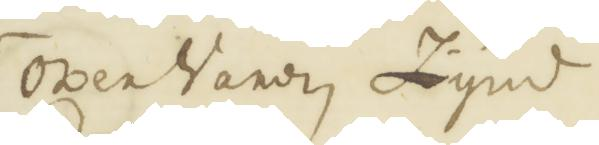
overvaren zijne
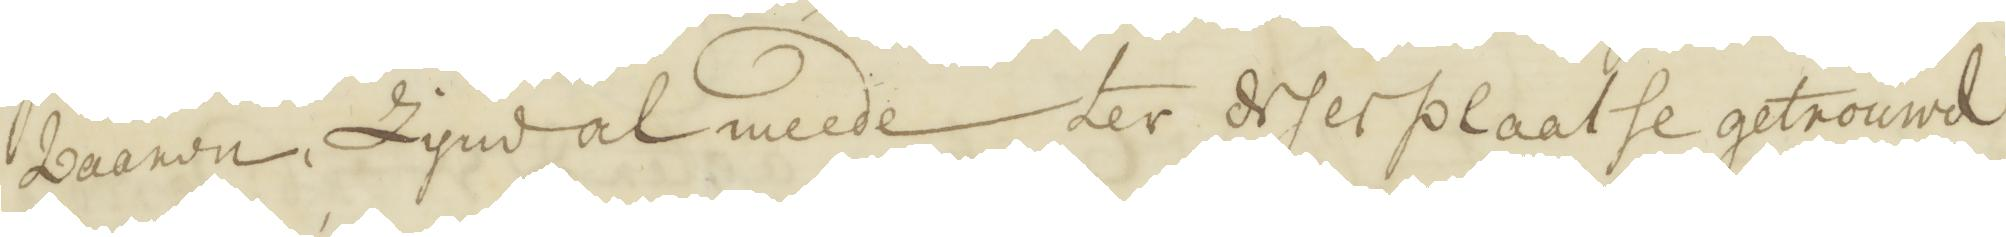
vaaren, zijne al meede ter deses plaatse getrouwd
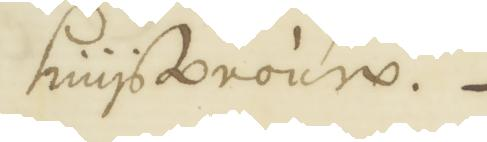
huijsvrouw.
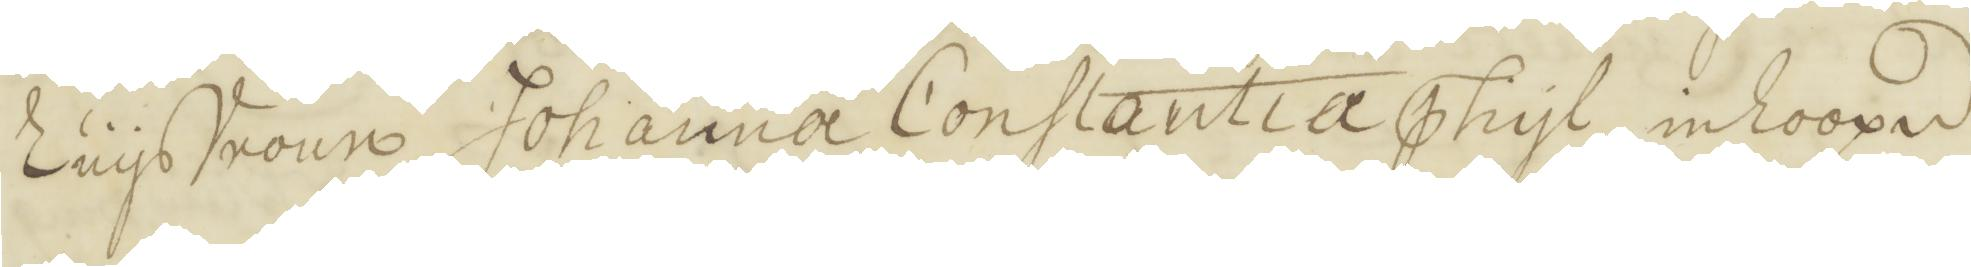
huijsvrouw Johanna Constantia phijl, inhoopn
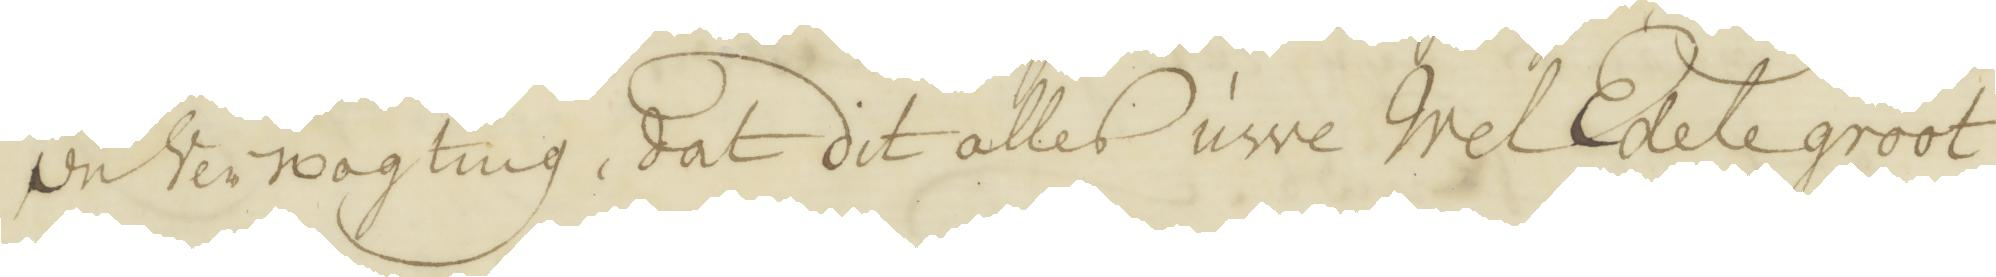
en verwagting, dat dit alles uwe Wel Edele groot
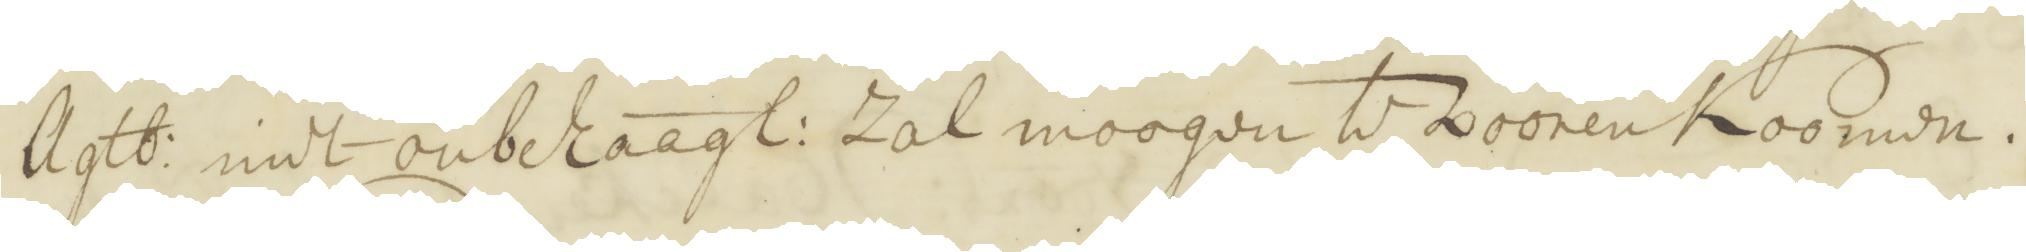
Agtb: niet onbehaagt: zal moogen te voorenkoomen.
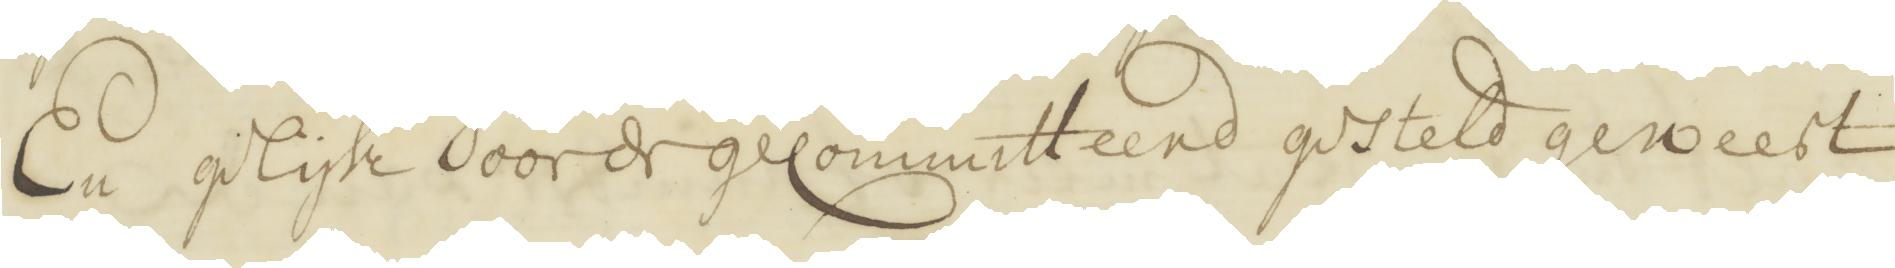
En gelijk door de gecommitteerd gesteld geweest
